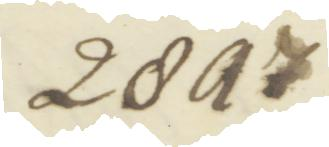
2847
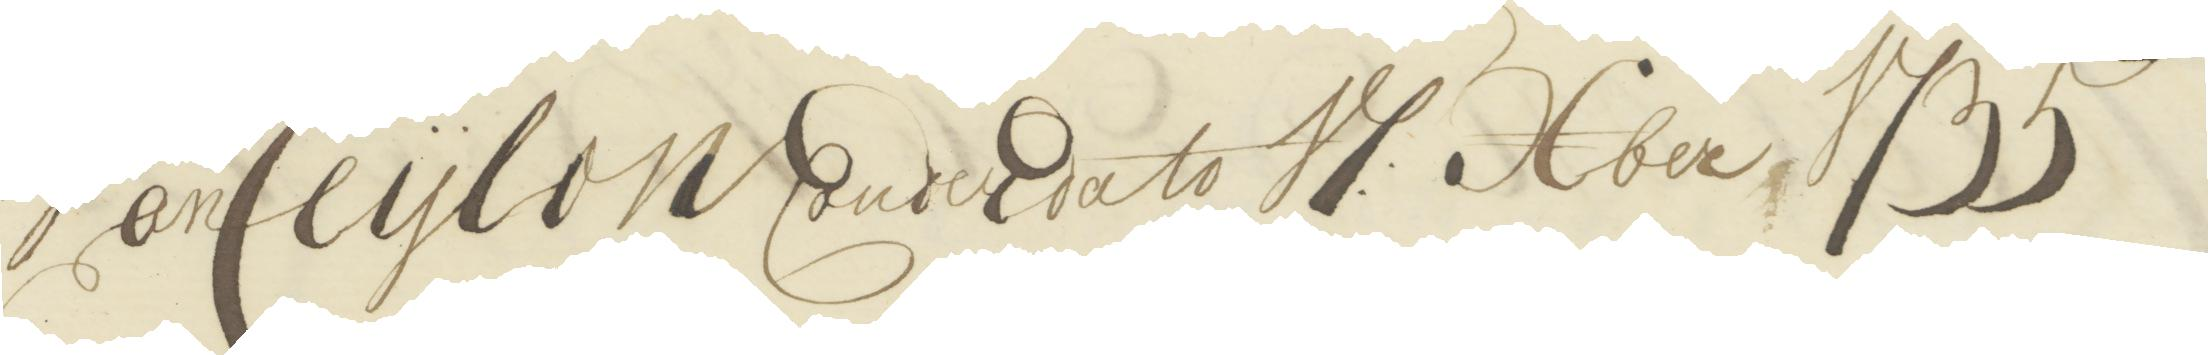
Van Ceijlon onder dato 17:' Xber 1735
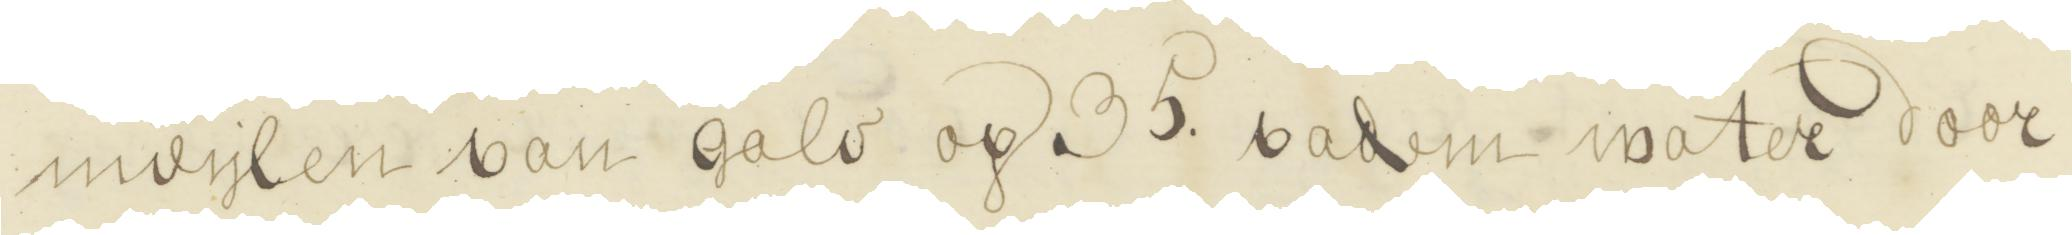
meijlen van gale op 35. vadem water door
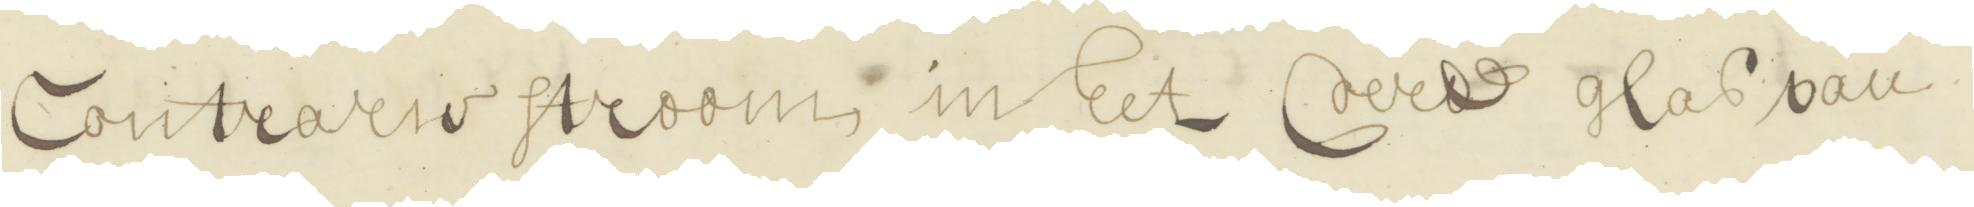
Contrarie stroom in het derde glas van
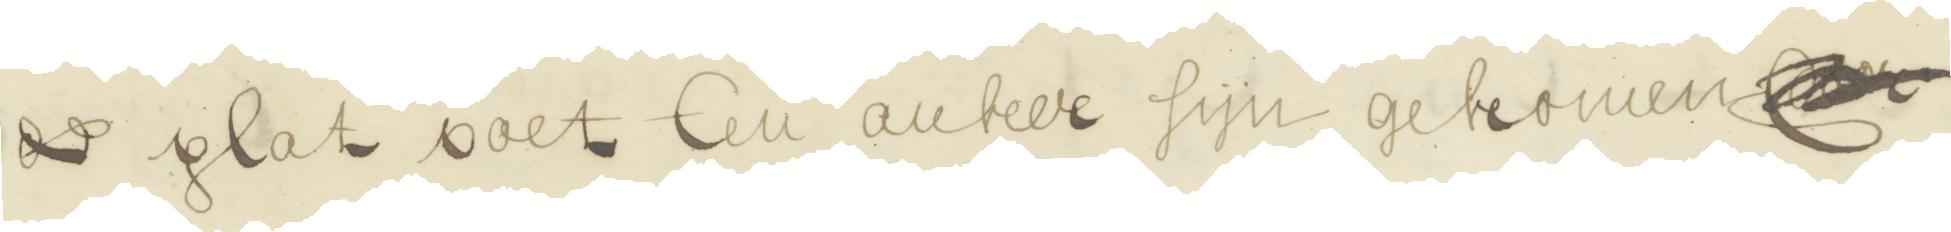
de plat voet ten anker sijn gekomen der
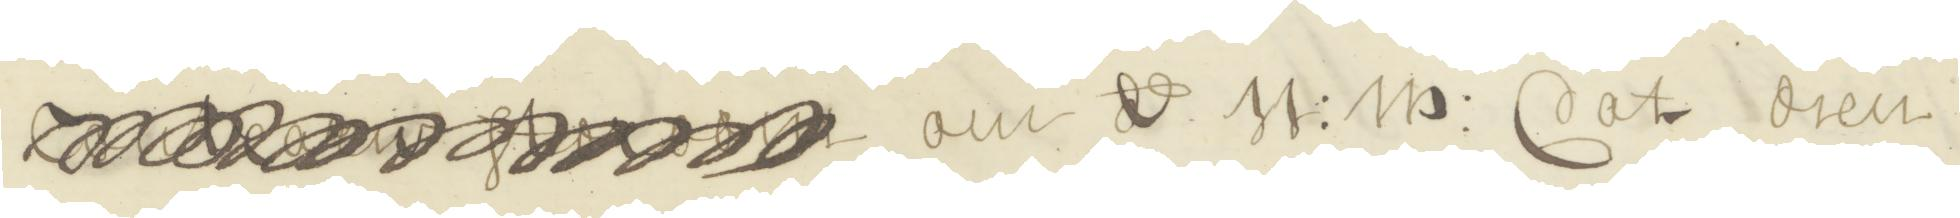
contrarie getreden om de W: W: dat dien
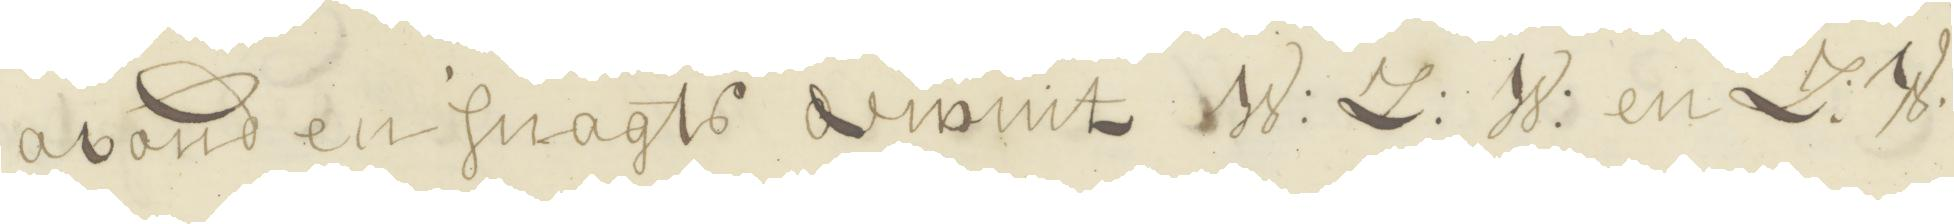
avond en snagts dewint W: Z: W: en Z: W:
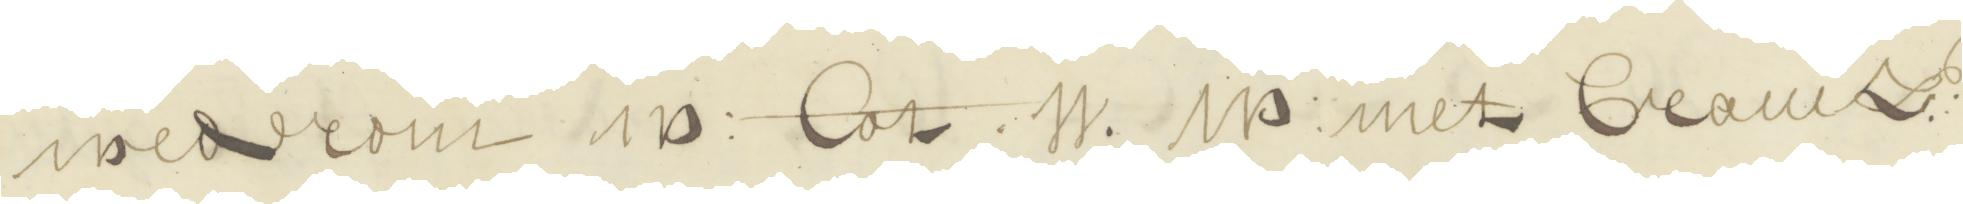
wederom w: tot. W. W: met bramz:s
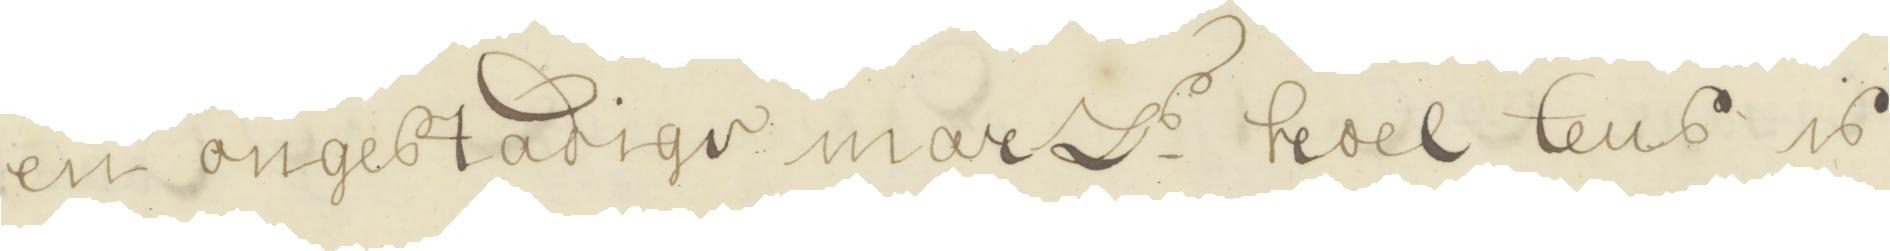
en ongestadige marz:s koel tens is
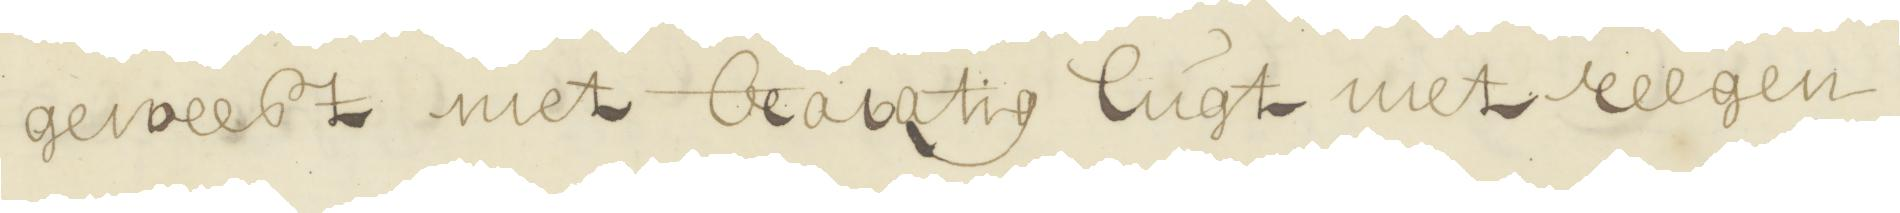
geweest met travatig lugt met reegen
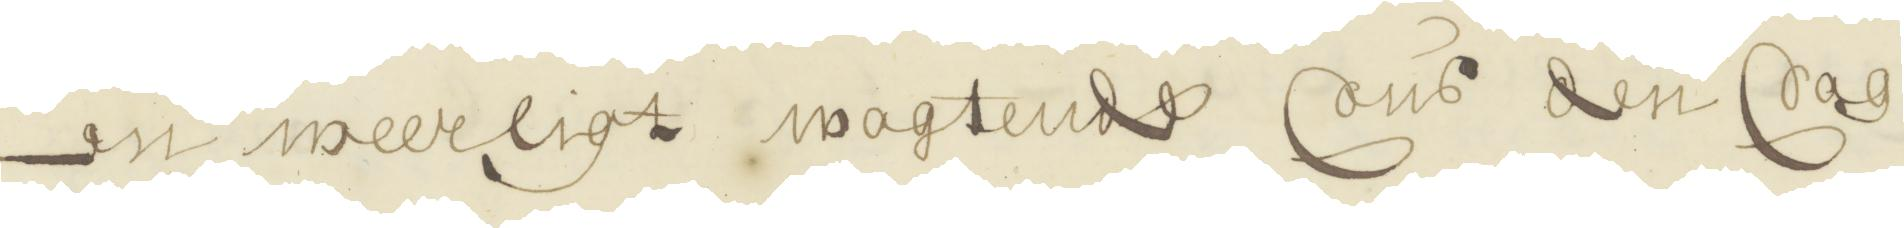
en weerligt wagtende dus den dag
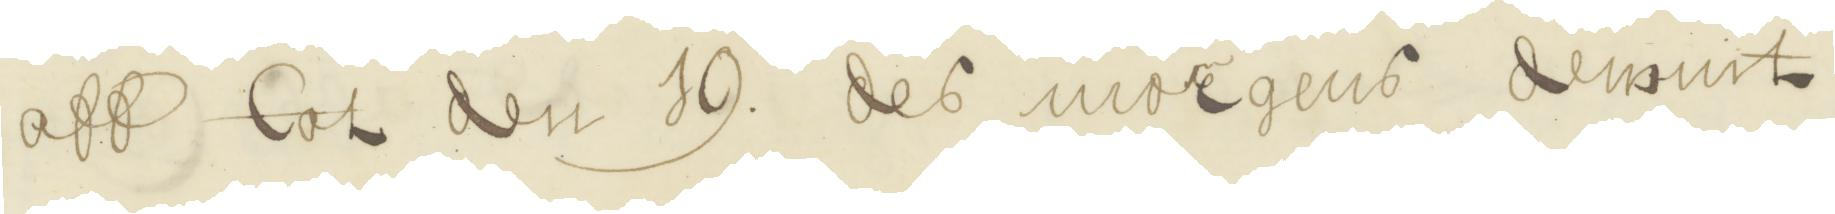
aff tot den 19.' des morgens de wint
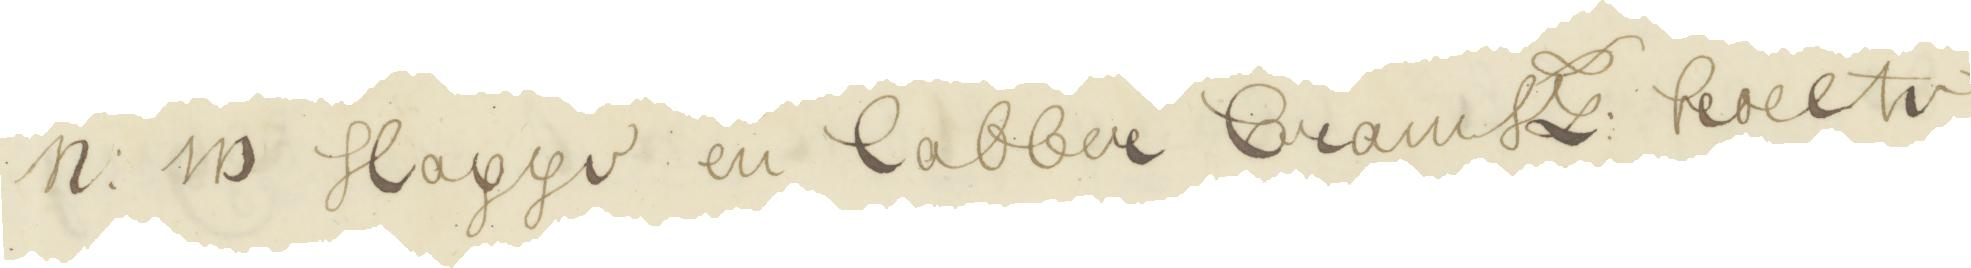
n: w: slappe en labber bramsz: koelte
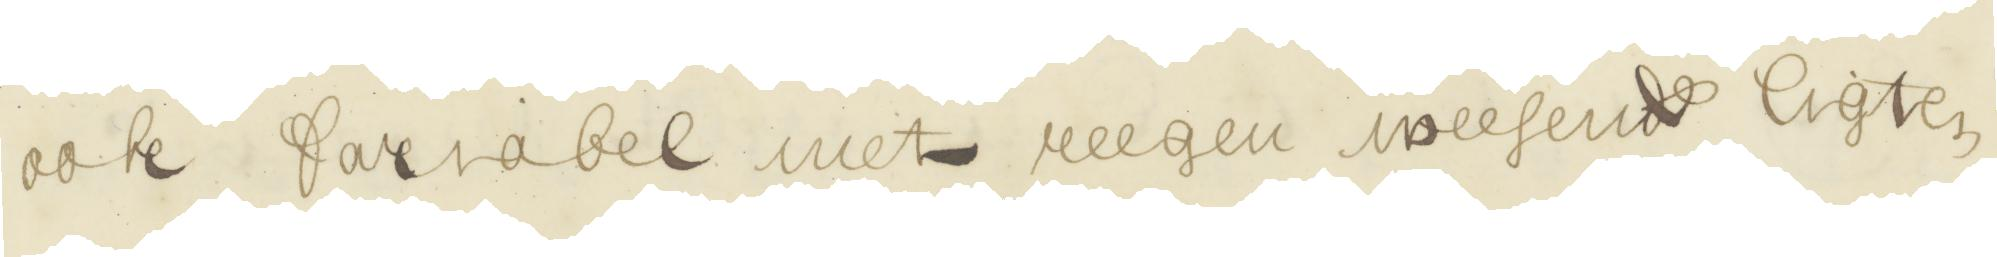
ook fariabel met reegen weesende ligten
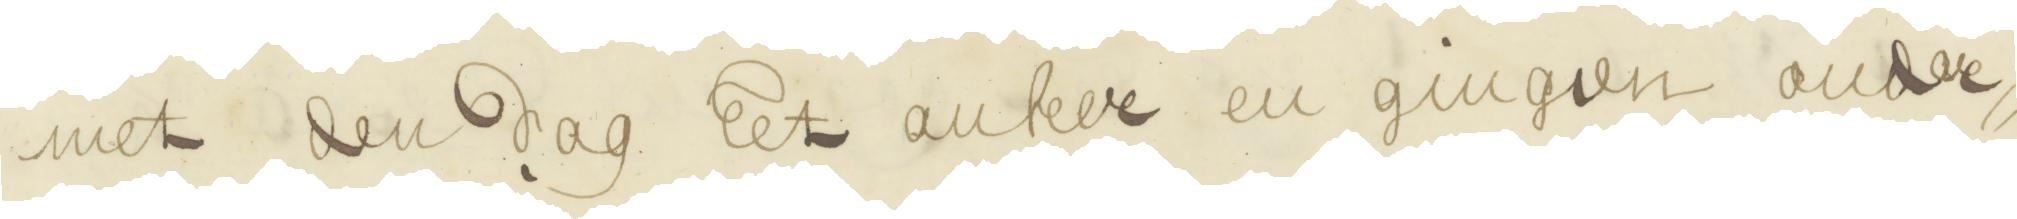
met den dag het anker en gingen onder„
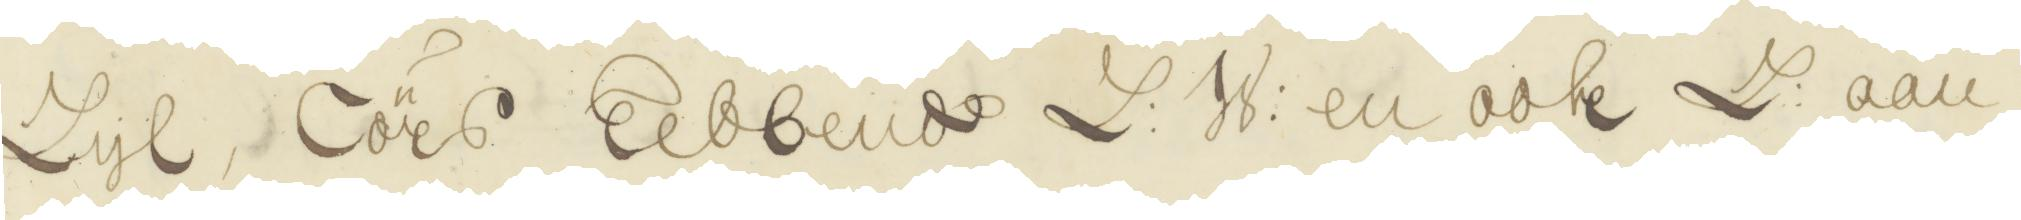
Zijl, Cours hebbende Z: W: en ook Z: aan
